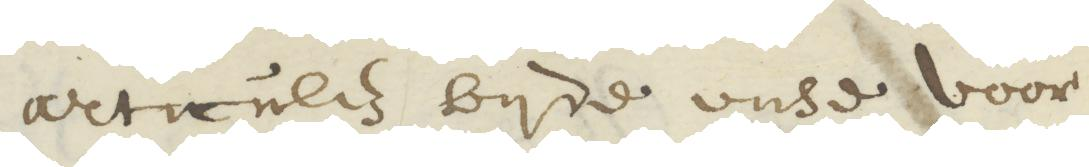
articulen byde onse voor
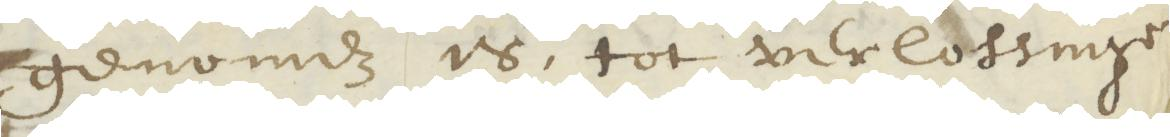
genomen is, tot verlossinge
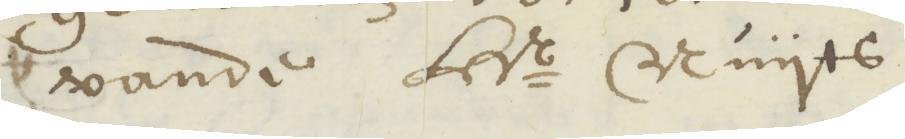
vande H=r Nuijts
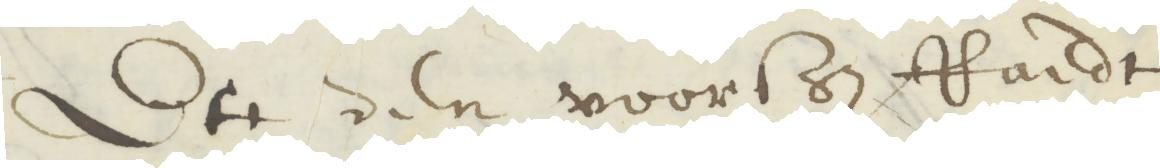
Oft den voorsz Raedt
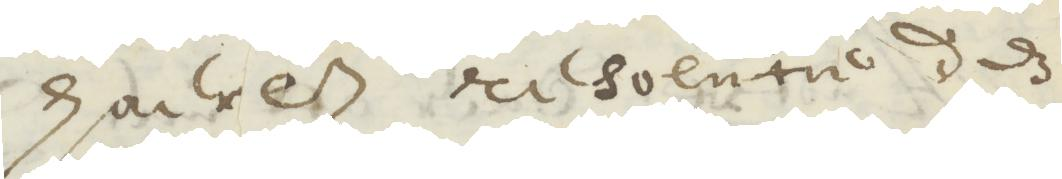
haerlijk resolutie den
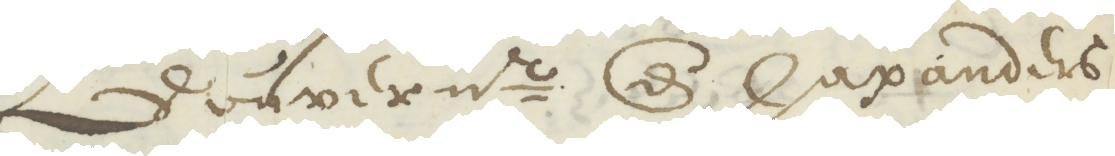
Gouvern=r ende Japanders
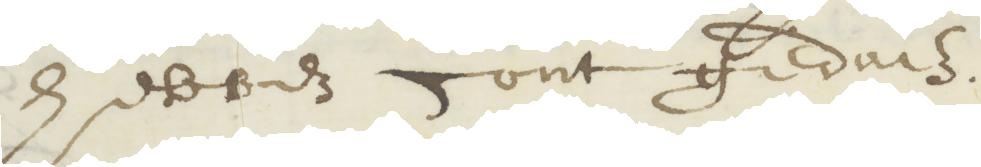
hebben cont gedaen.
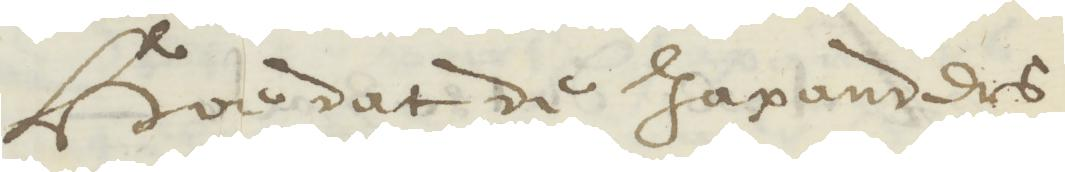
Hoedat de Japanders
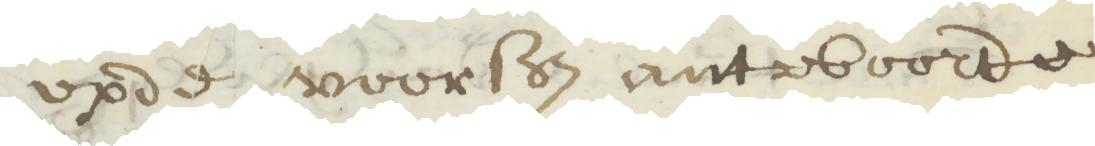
op de voorsz antwoorde
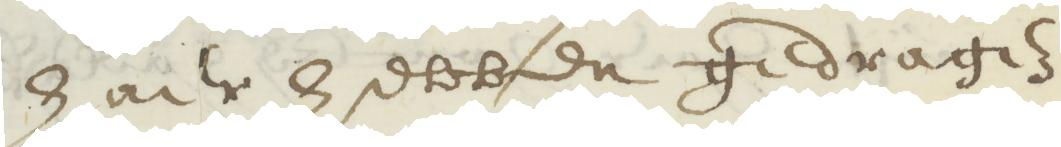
haer hebben gedragen
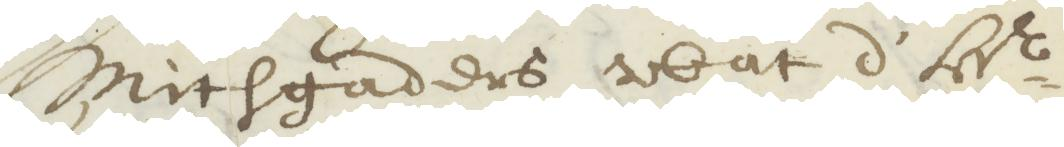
Mitsgaders wat d’ h=r
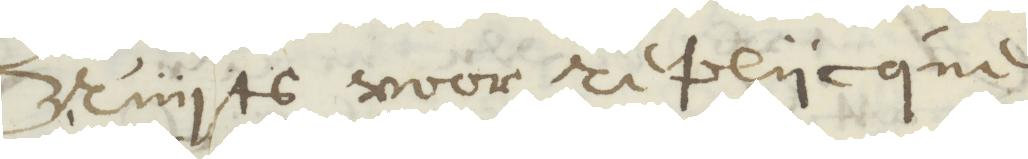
Nuijts voor replijcque
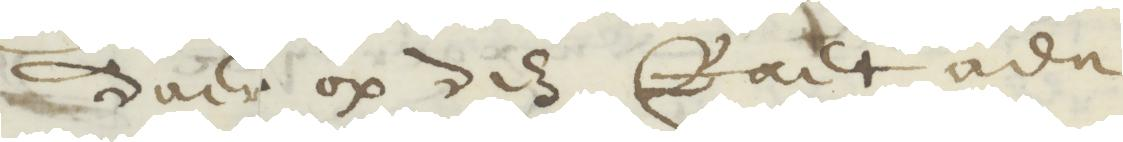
daer op den Raet aen
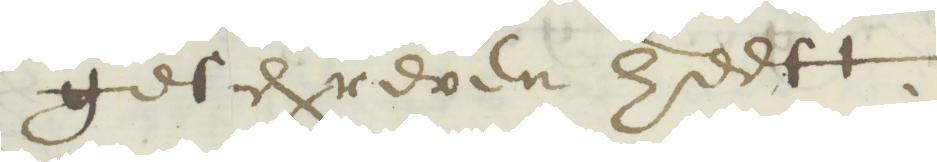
geschreven heeft.
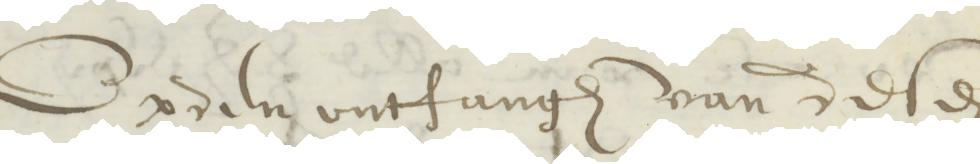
Op den ontfangen van desen
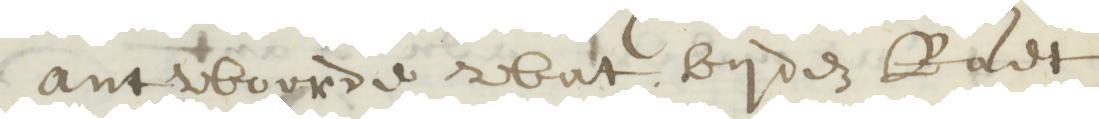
antwoorde wat byden Raet
